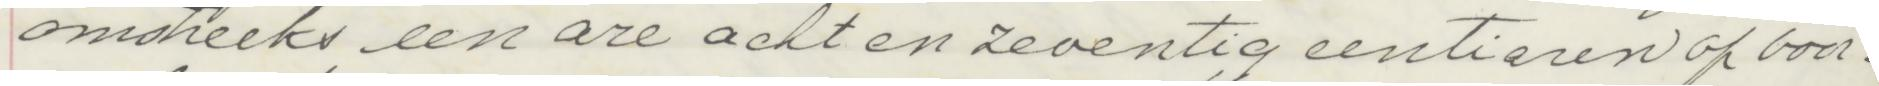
omstreeks een are acht en zeventig centiaren op voor-
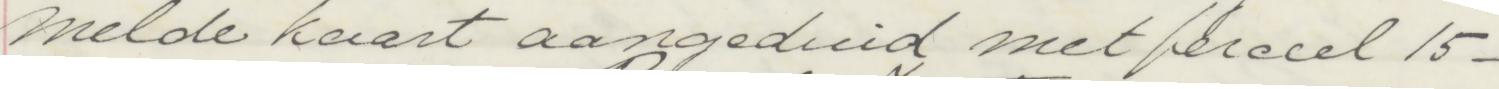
melde kaart aangeduid, met perceel 15-
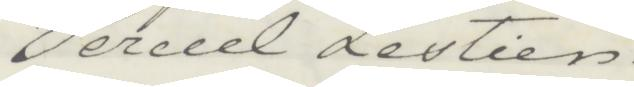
Perceel Zestien.
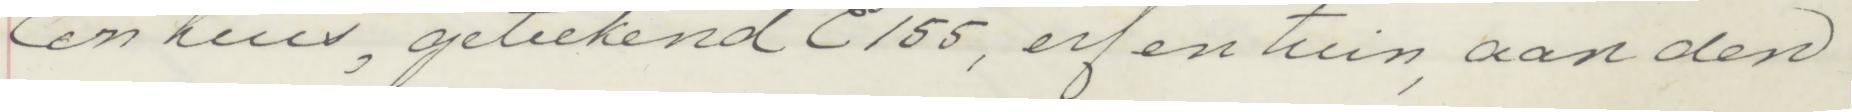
Een huis, geteekend E 165, erf en tuin, aan den
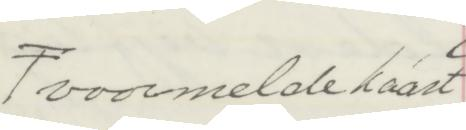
¶ voormelde kaart
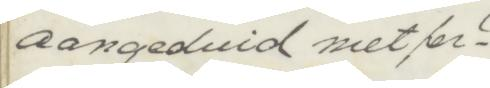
Aangeduid met per-
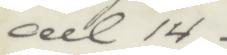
ceel 14
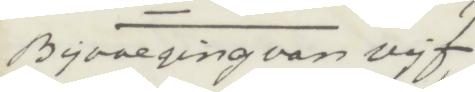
Bijvoeging van vijf
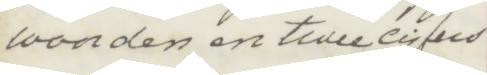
woorden en twee cijfers
